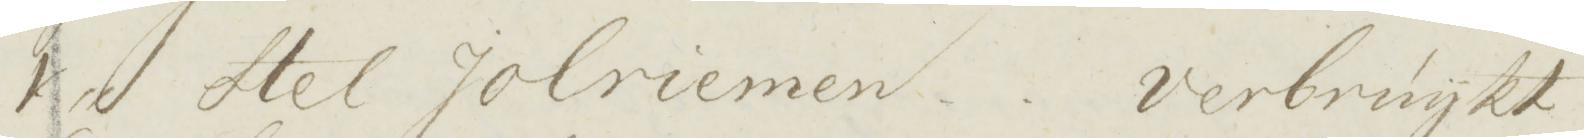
1: „ stel Jolriemen . . verbruijkt
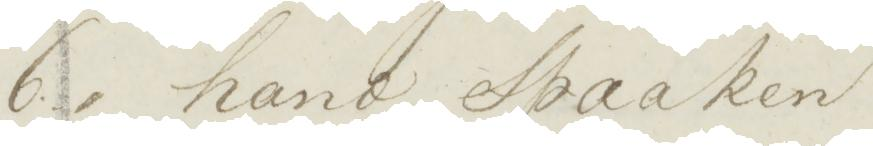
6: „ hand spaaken
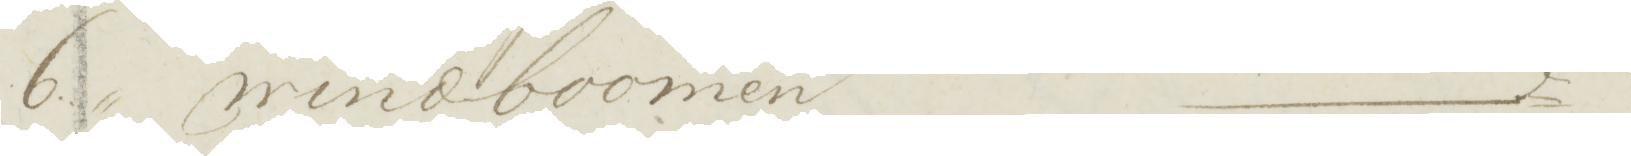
6: „ windboomen __o
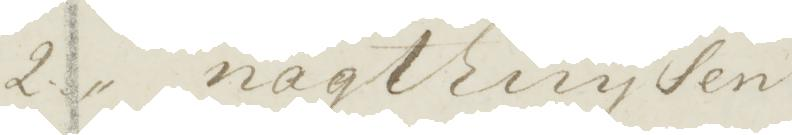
2: „ nagthuijsen
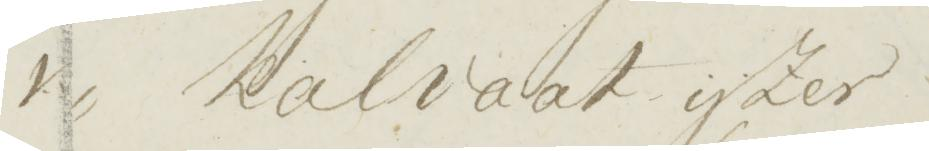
1: „ Kalvaat ijzer
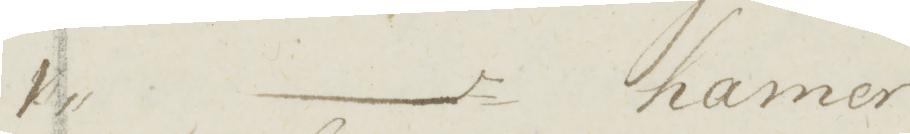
1.„ _= hamer
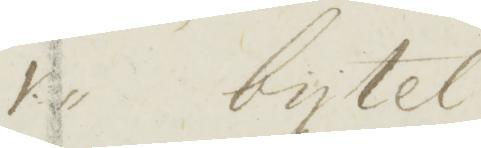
1: „ bijtel
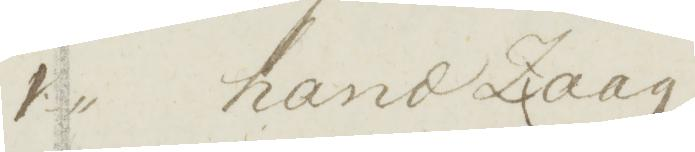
1: „ hand Zaag
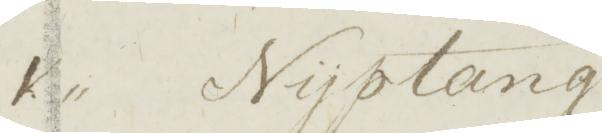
1: „ Nijptang
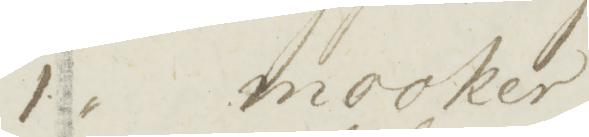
1. „ mooker
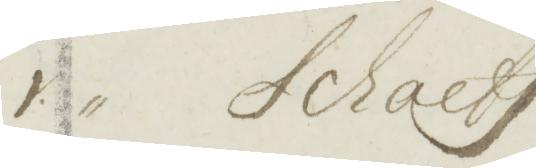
1. „ Schaeff
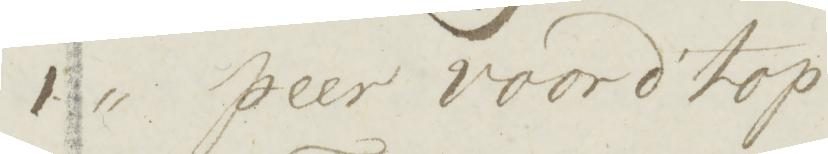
1: „ peer voor d' top
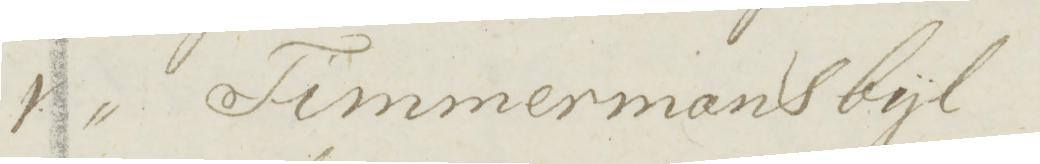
1. „ Timmermans bijl
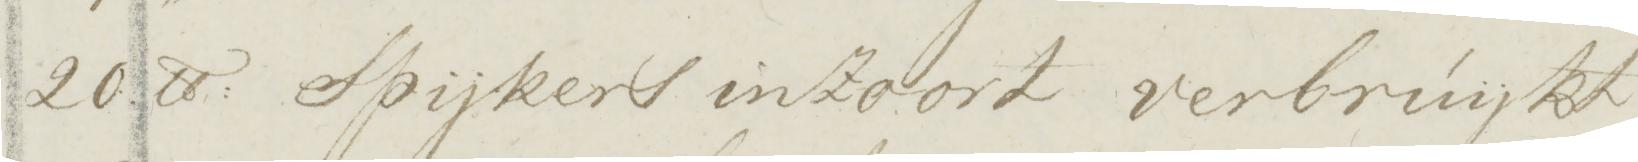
20: lb: Spijkers inzoort verbruijkt
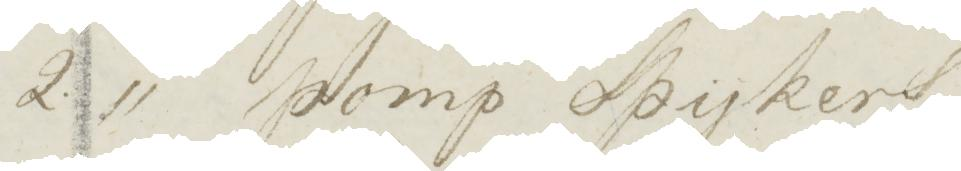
2. „ pomp Spijkers
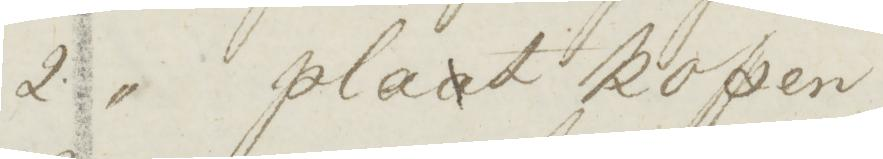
2: „ plaat koppen
